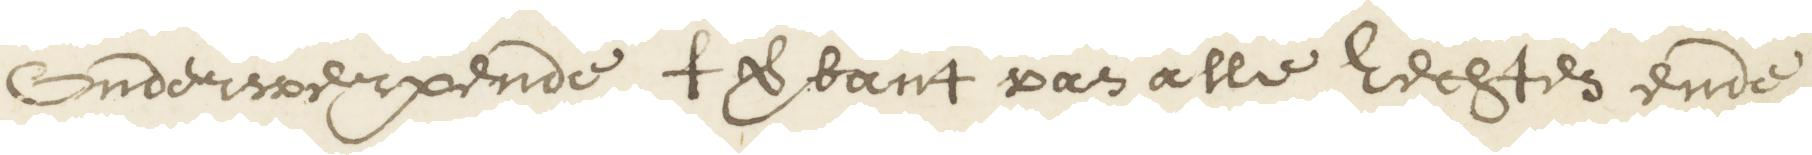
Onderwerpende t verbant van alle rechten ende
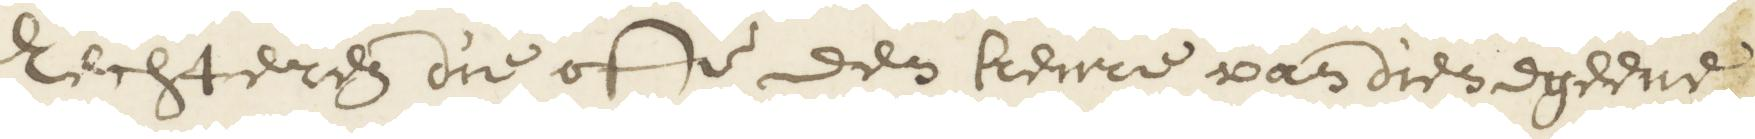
rechteren die ofte een keure van dienegeene
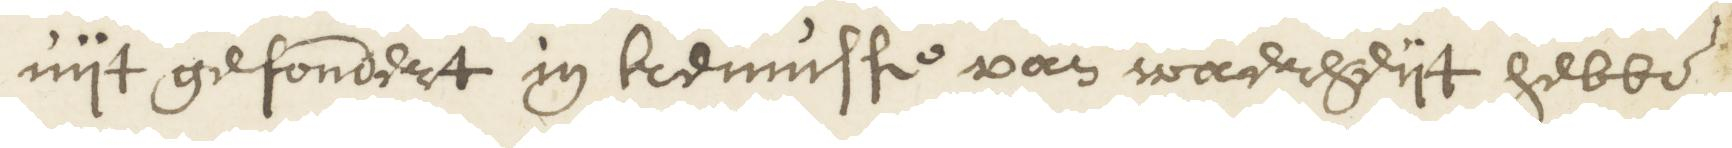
uijt gesondert in kennisse van waerheijt hebbe
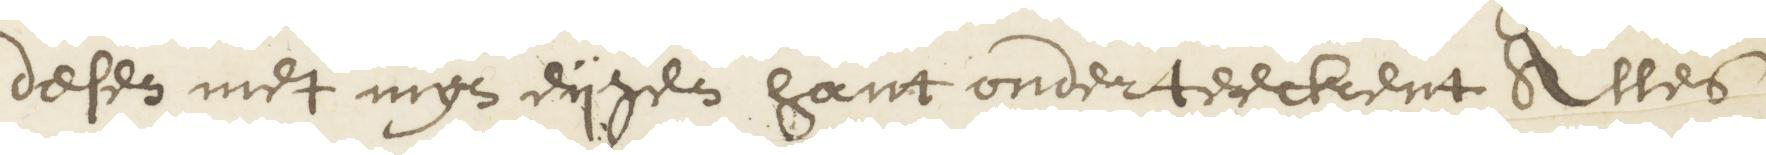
desen met myn eijgen hant onderteeckent Alles
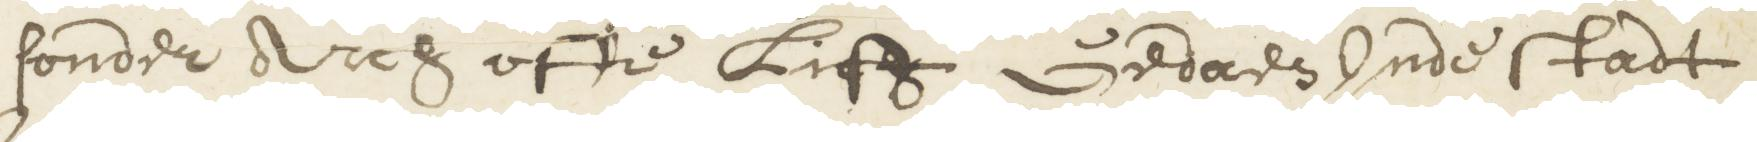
sonder Arch ofte List Gedaen Jnde stadt
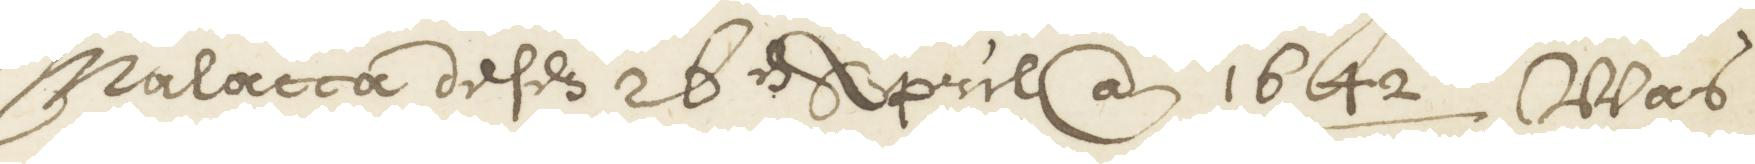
Malacca desen 26en April @ 1642 Was
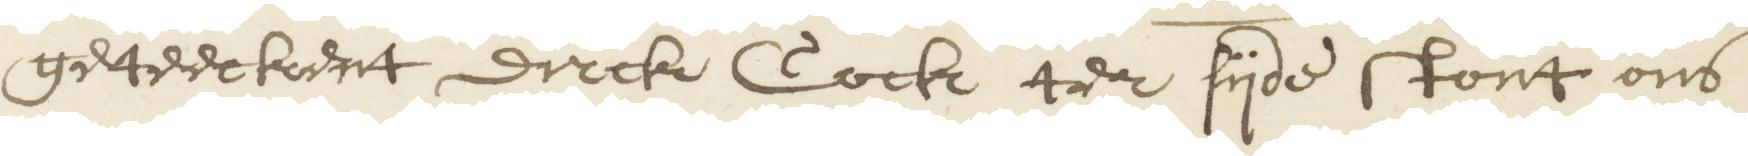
geteeckent Dirck Cock ter sijde stont ons
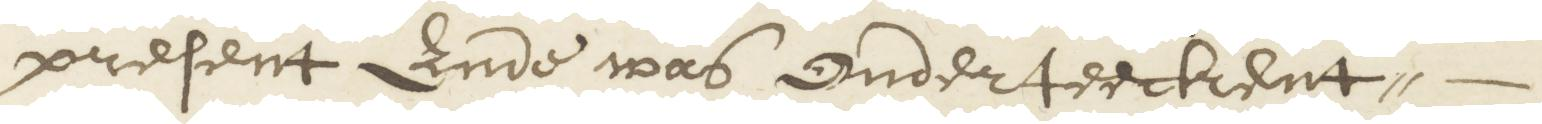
present Ende was onderteeckent„ —
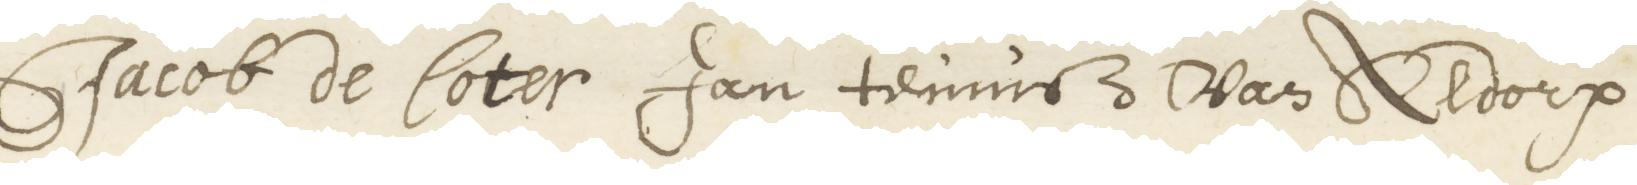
Jacob de Coter Jan teunisz van Aldorp
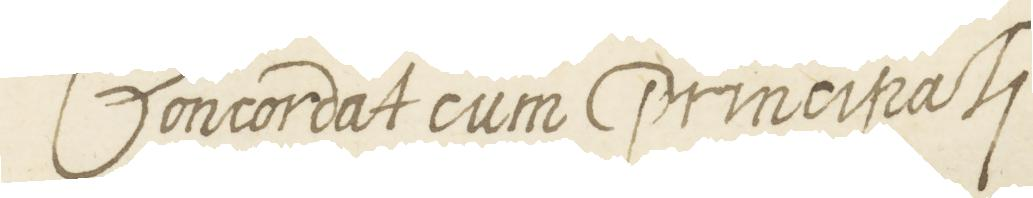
Concordat cum principalj
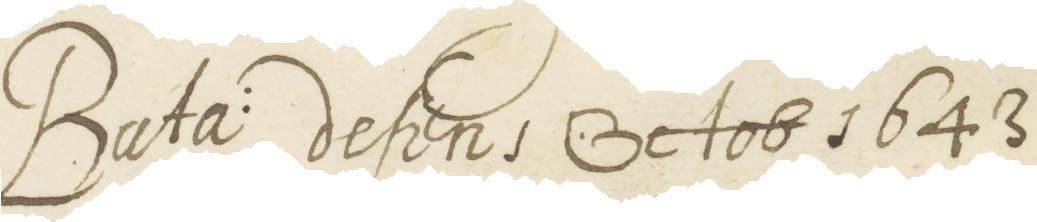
Bata: desen 1 Octob 1643
